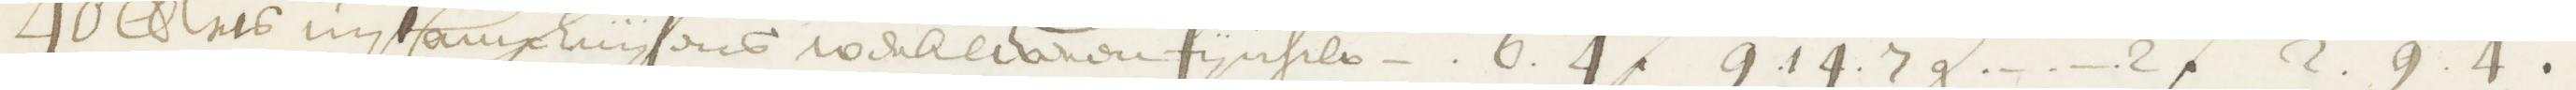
40 lb Erts uijt Camphuijsens werk leveren fijnsilv —. 6. 4 ƒ 9. 14. 7 g.t —. —. 2 ƒ 2. 9. 4.
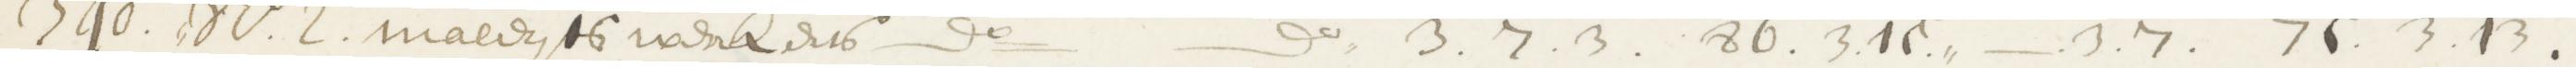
340. „N.o 2. maleijts werk erts _=o _=o 3. 7. 3. 86. 3. 15. „ —. 3. 7. 75. 3. 13.
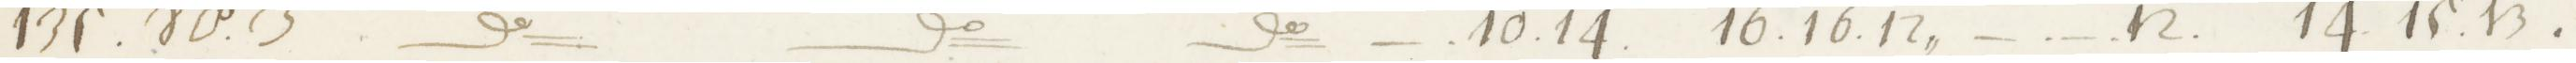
135. N.o 3. _=o _=o _=o —. 10. 14. 16. 16. 12 „ —. —. 12. 14. 15. 13.
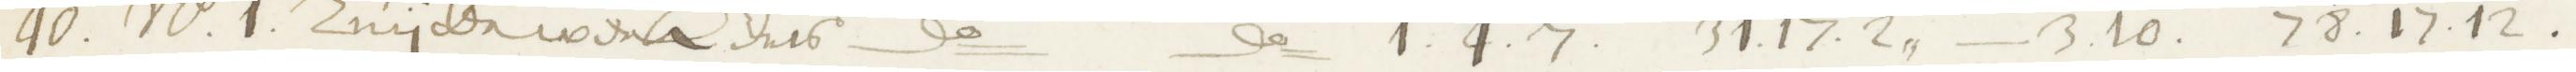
40. N.o 1. zuijder werk Erts _=o _=o 1. 4. 7. 31. 17. 2 „ —. 3. 10. 78. 17. 12.
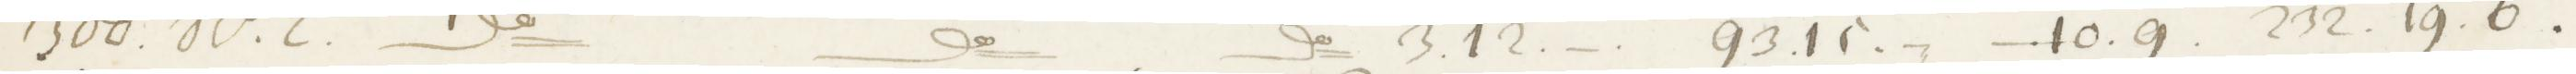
300. N.o 2. _=o _=o _=o 3. 12. —. 93. 15. — „ —. 10. 9. 232. 19. 6.
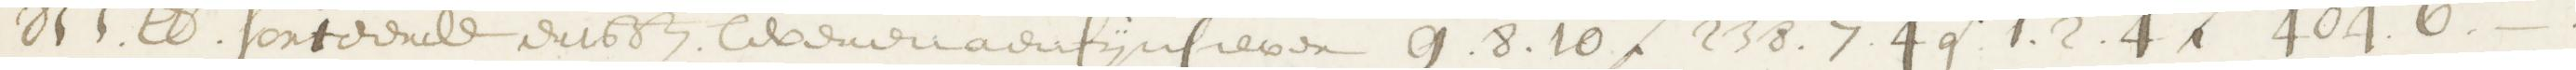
855. lb. sorteerde ertstz. leveren aen fijnsilver 9. 8. 10 ƒ 238. 7. 4 g.t 1. 2. 4 ƒ 404. 6. —.
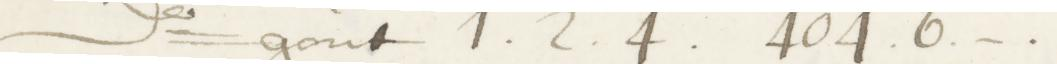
_=o gout 1. 2. 4. 404. 6. —.
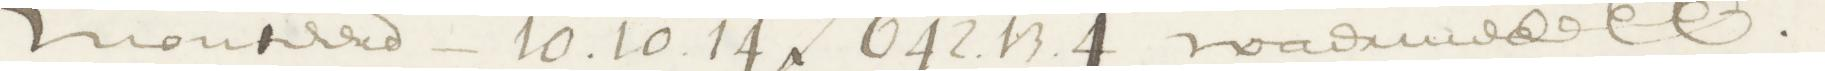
monteerd — 10. 10. 14 ƒ 642. 13. 4 waermede EE.
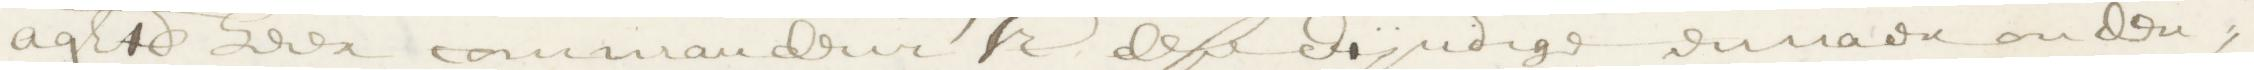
aghtb heer commandeur K dese Eijndige en naer onder„
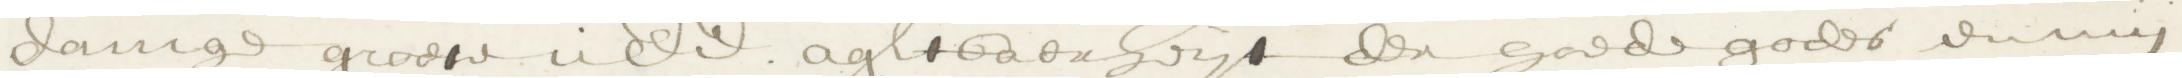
danige groete uEE. aghtbaerheijt der goede godes en mij
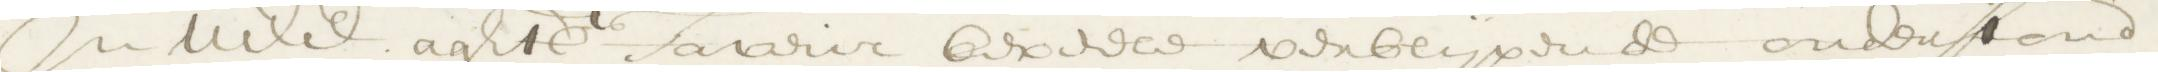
In uEE. aghtb:ts saveur beveele verblijvende onderstond
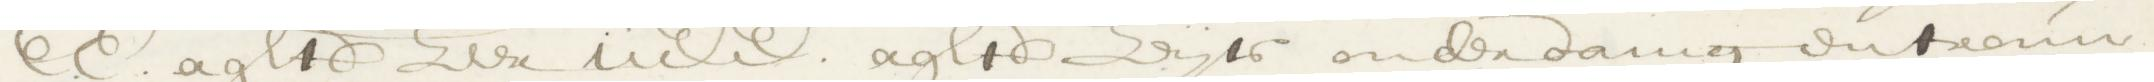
EE. aghtb heer uEE. aghtb heijts onderdanig en trouw
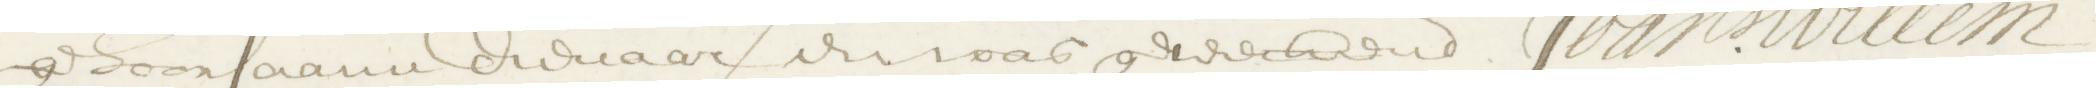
gehoorsaame dienaar / en was geteeckend Joans Willem
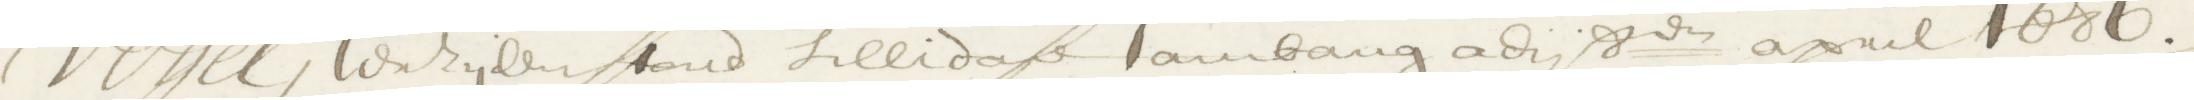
Vogel, ter zijden stond sillidase tambang adij 8=en april 1686.
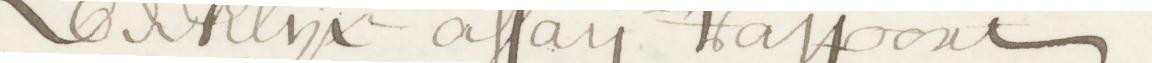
Weeklijx assaij Rapport
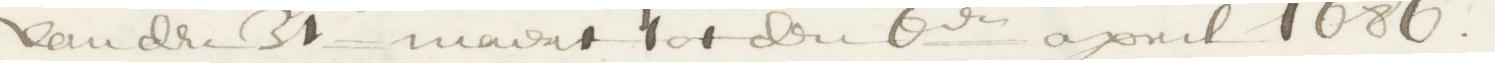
van den 31=' maert tot den 6=en april 1686.
